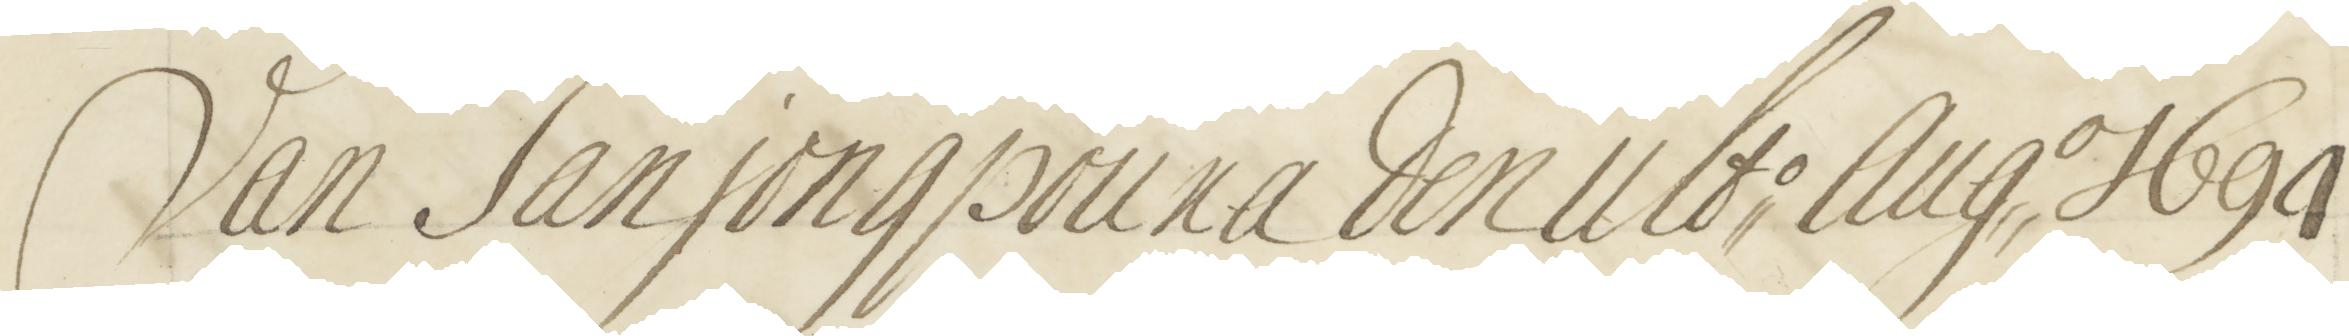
Van Tanjongpoura den ult„o Aug„o 1694
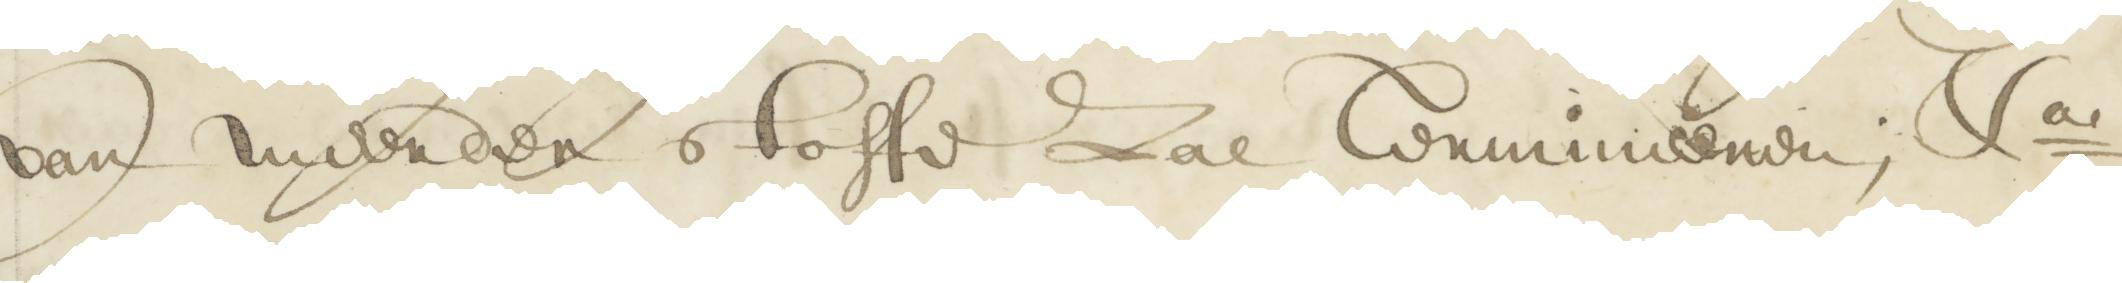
van Meerder stoffe zal Termineeren; &=a
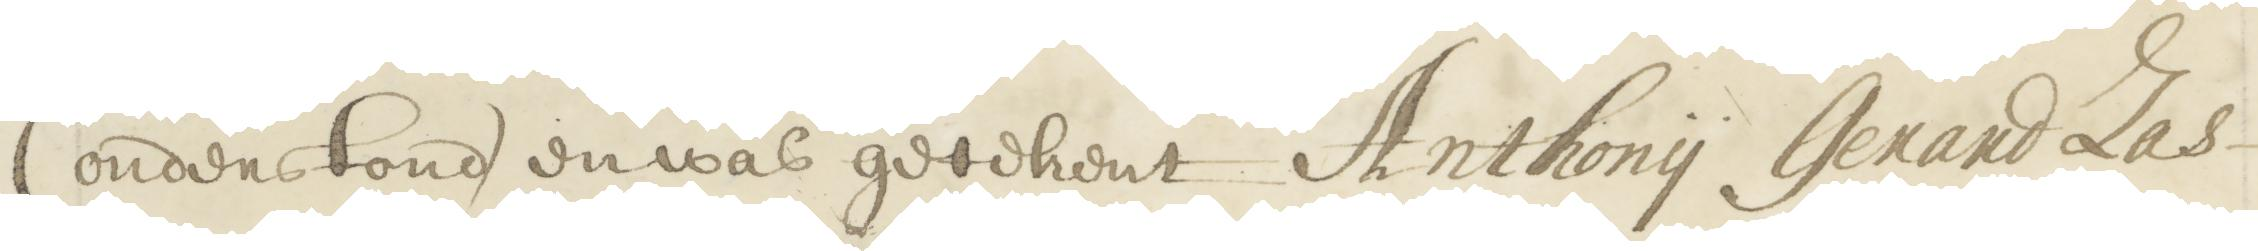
(onderstond) en was getekent Anthonij Gerard Zas —
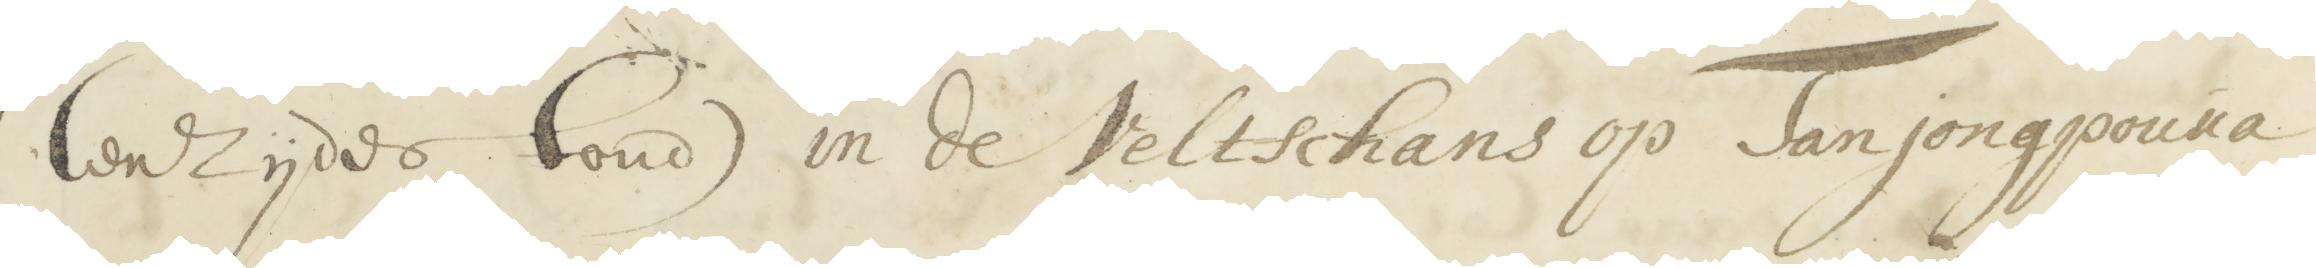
(terzijdestond) in de Veltschans op Tanjongpoura
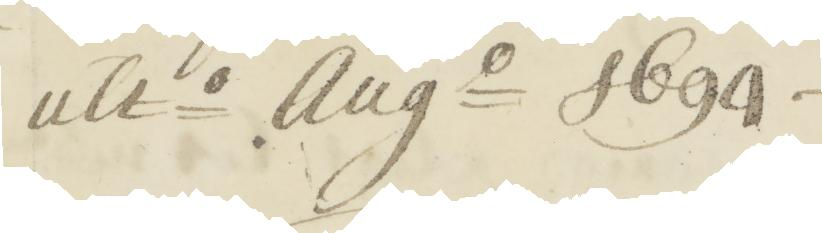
ult=o Aug=o 1694 —
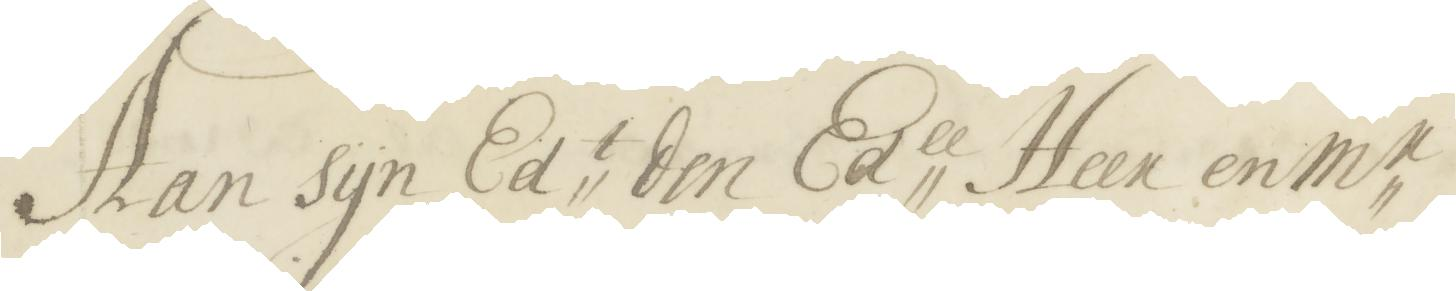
Aan sijn Ed„t den Ed„le Heer en M„r
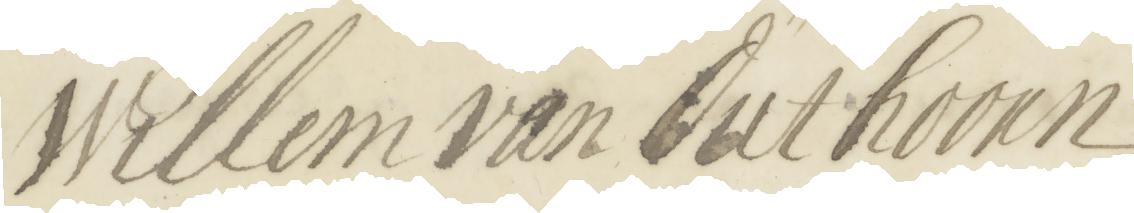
Willem van Outhoorn
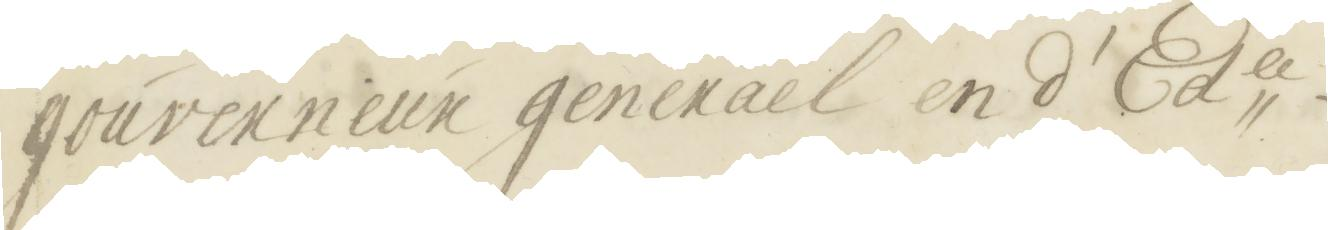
gouverneur generael en d’Ed=le —
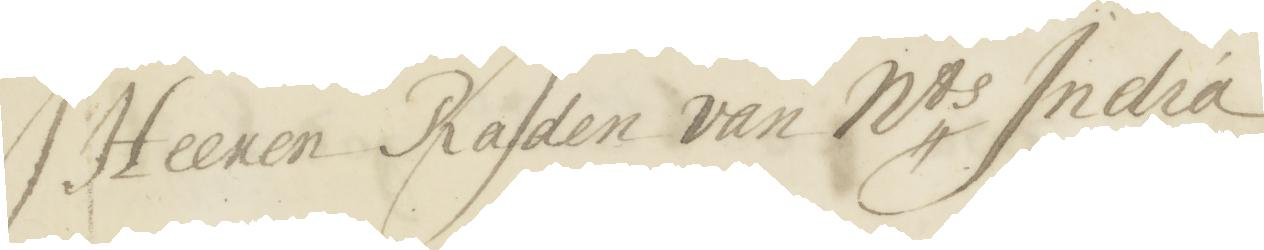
Heeren Raden van N„ts Jndia
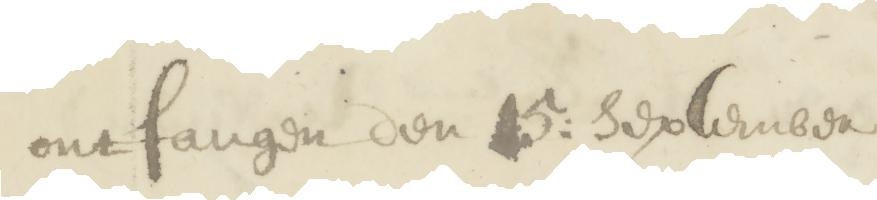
ontfangen den 15: September
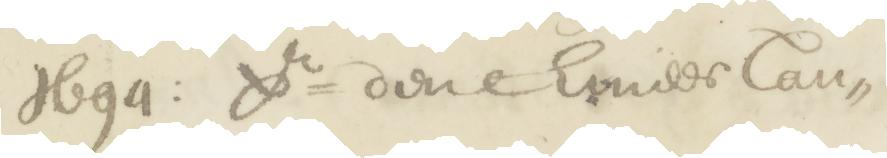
1694: p=r den chinees Tan„
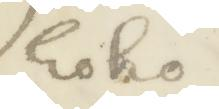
hoko
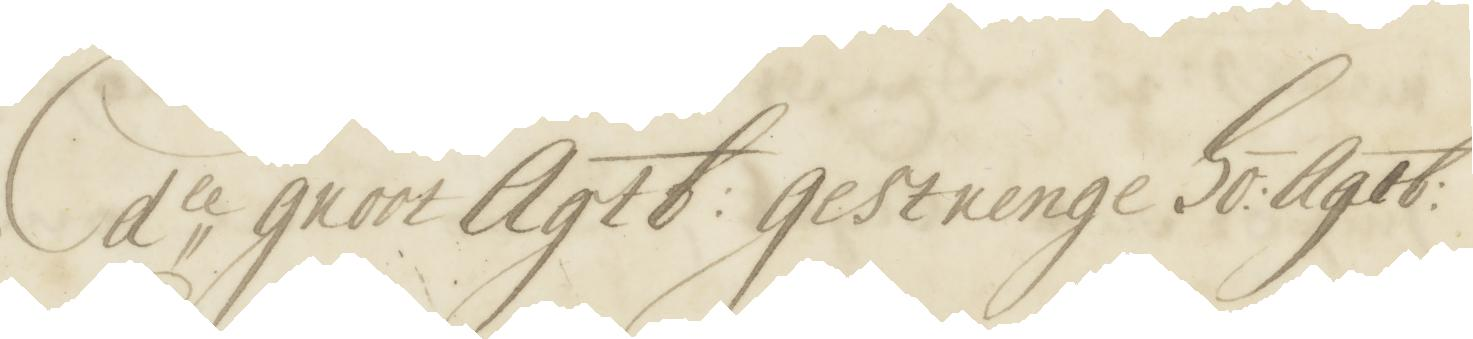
Ed„le groot Agtb: gestrenge Ho: Agtb:
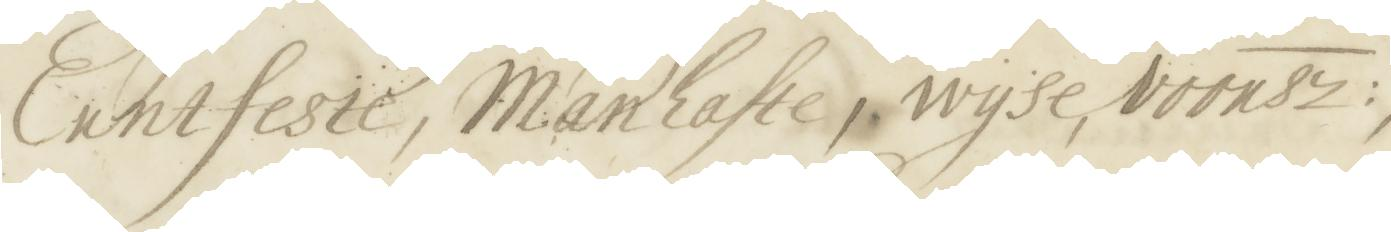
Erntfeste, Manhafte, wijse, voorsz:,
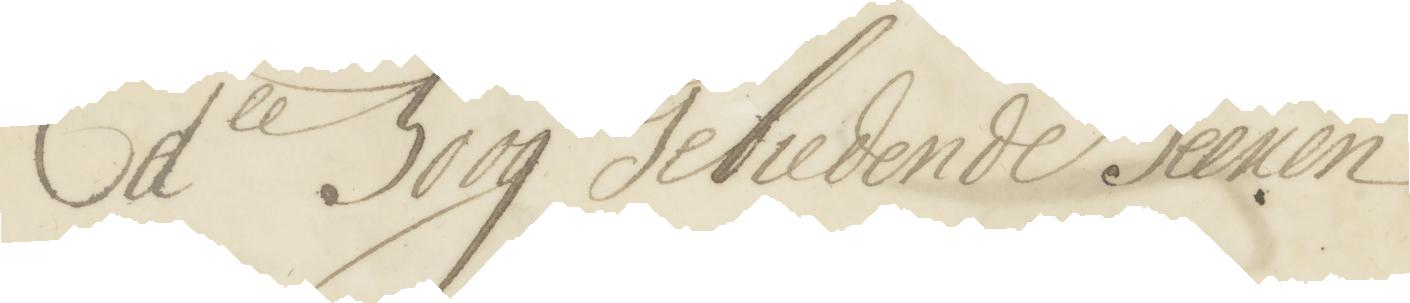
Edle Hoog Gebiedende Heeren
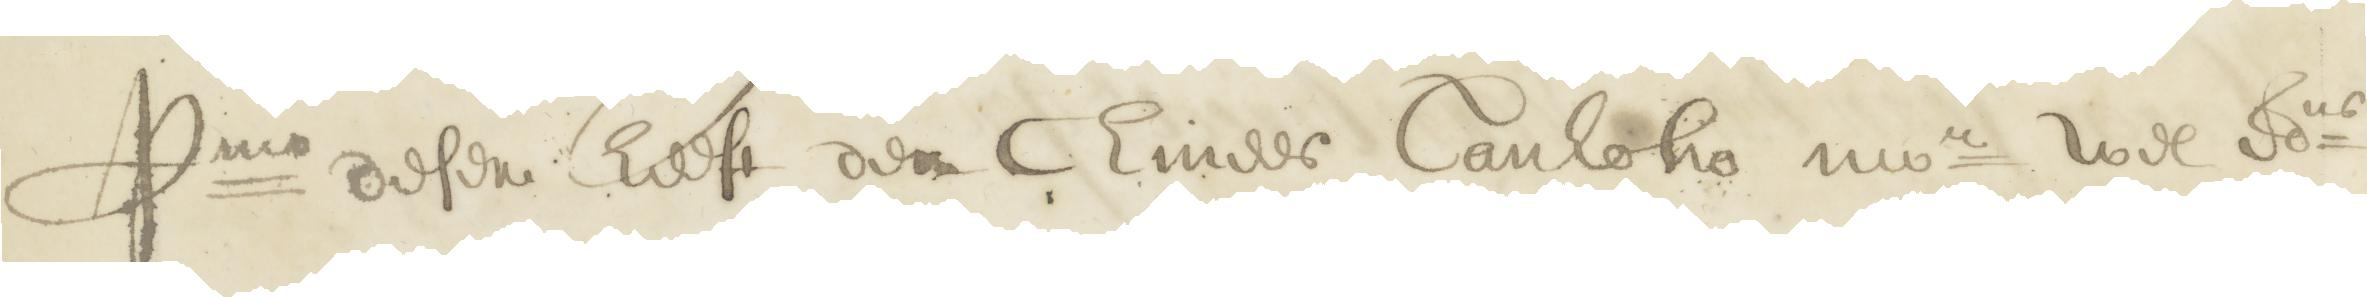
P=mo deser heeft de Chinees Tanhoko uw=r Wel Ed=ns
